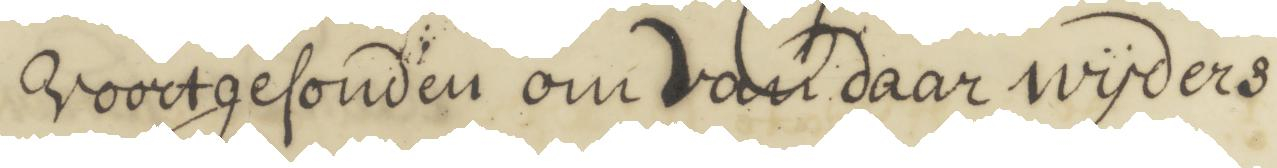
voortgesonden om van daar wijders
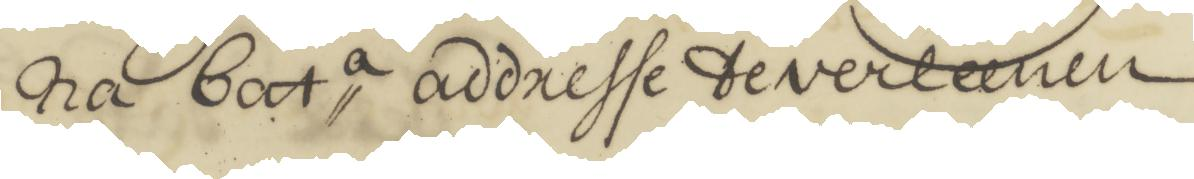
na bat„a addresse te verleenen
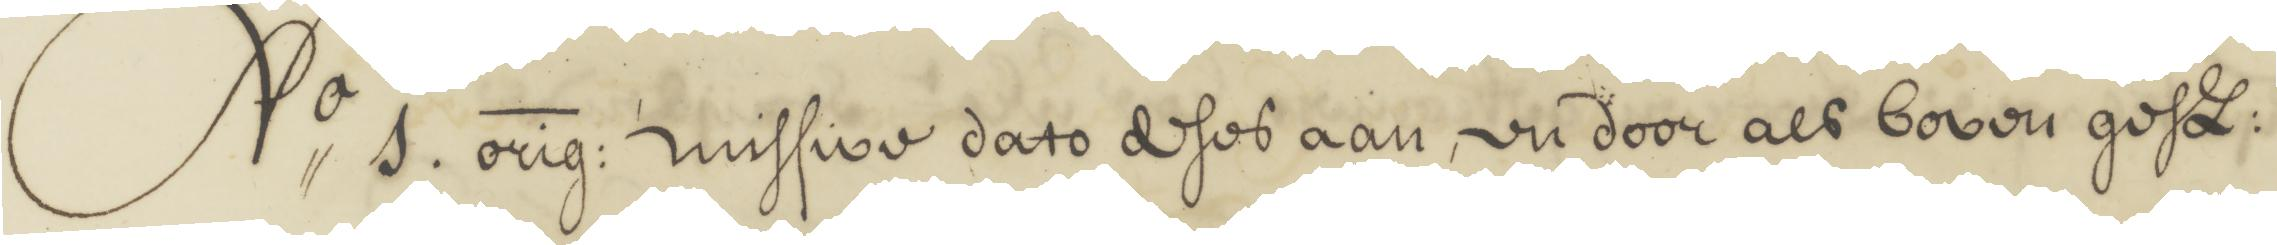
N„o 1. orig: missive dato deses aan, en door als boven gesz:
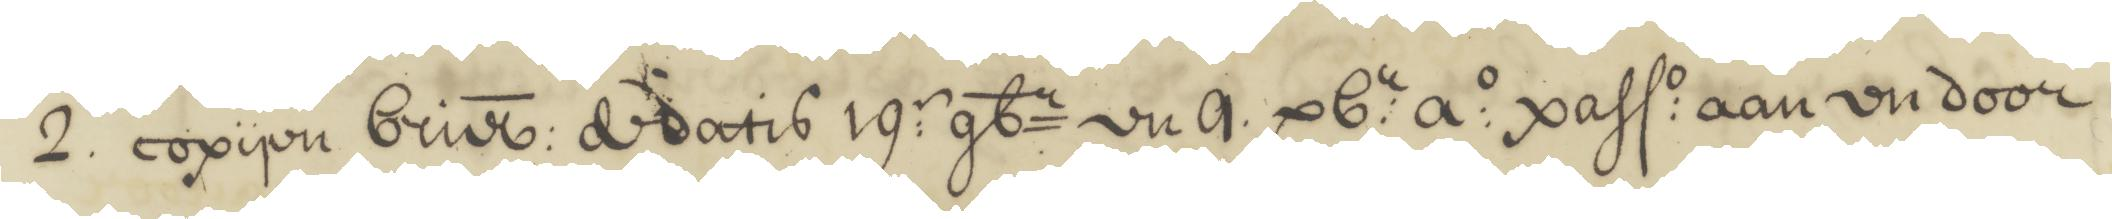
2. copijen briev: de datis 19:' gb=r en 4. xb:r a:o pass:o aan en door
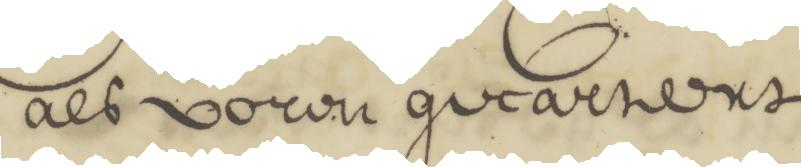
als voren gecarteert
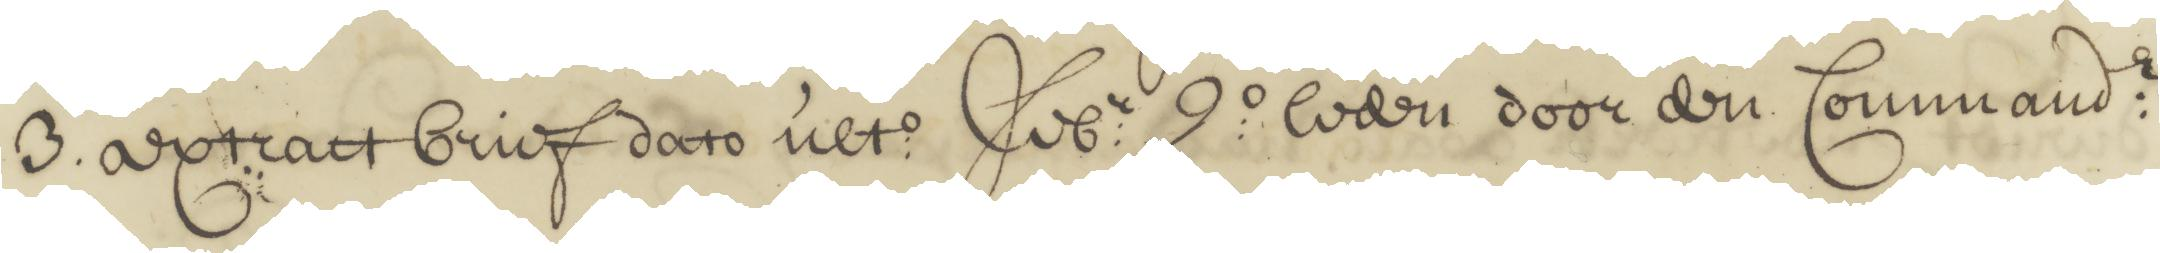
3. extract brief dato ult:o feb:r J:o leden door den Command:r
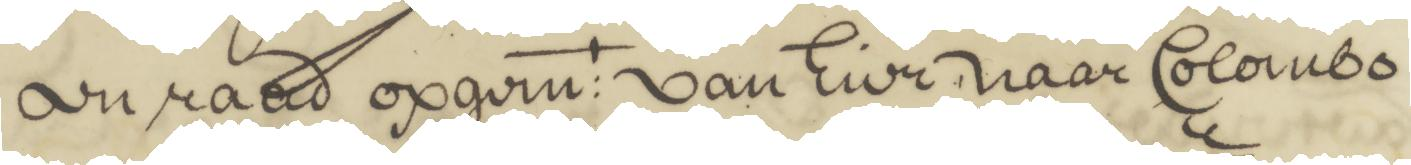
en raad opgem:t van hier naar Colombo
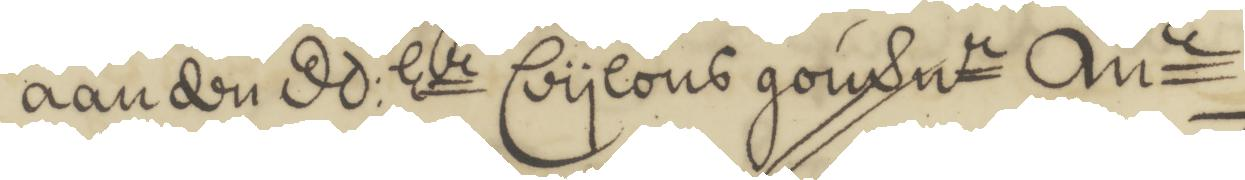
aan den Ed: h=r Ceijlons gouvern=r M=r
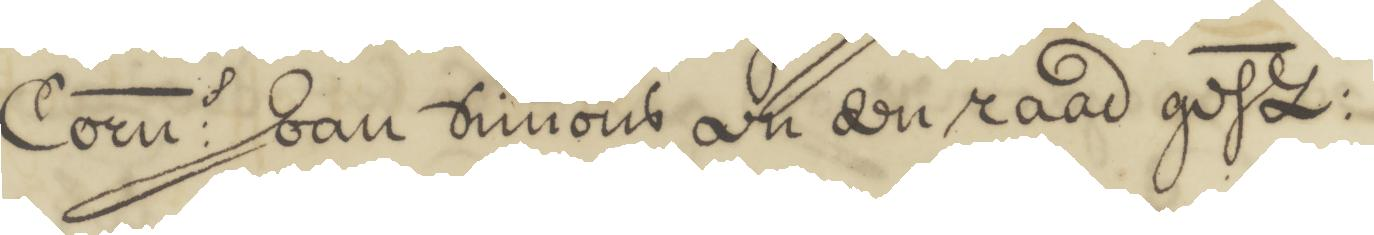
Corn:s Joan simons en den raad gesz:
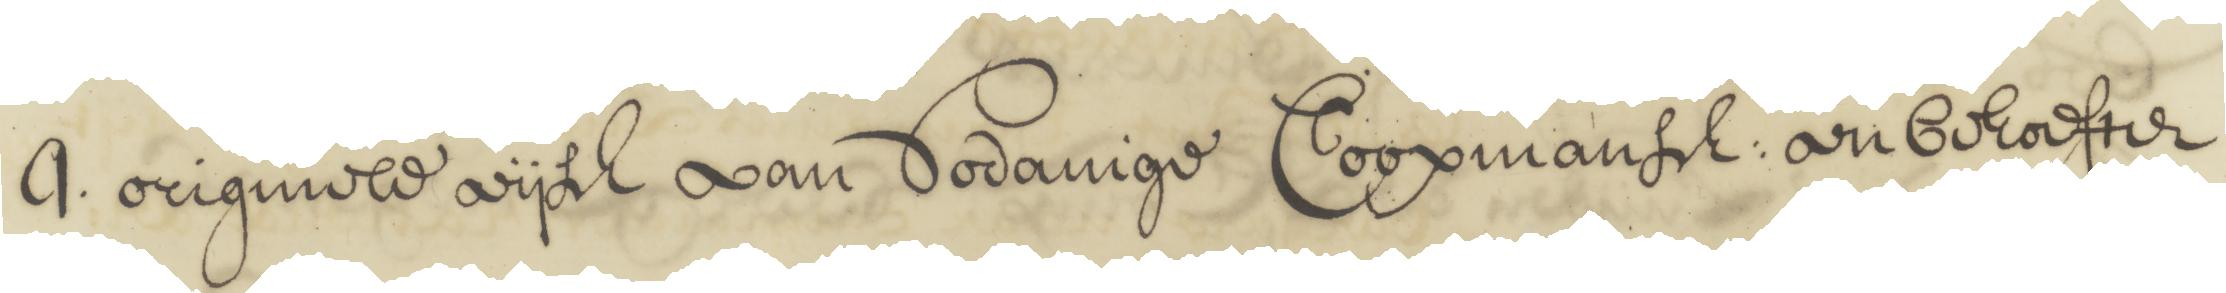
4. originele eijsch van sodanige Coopmansch: en behoeften
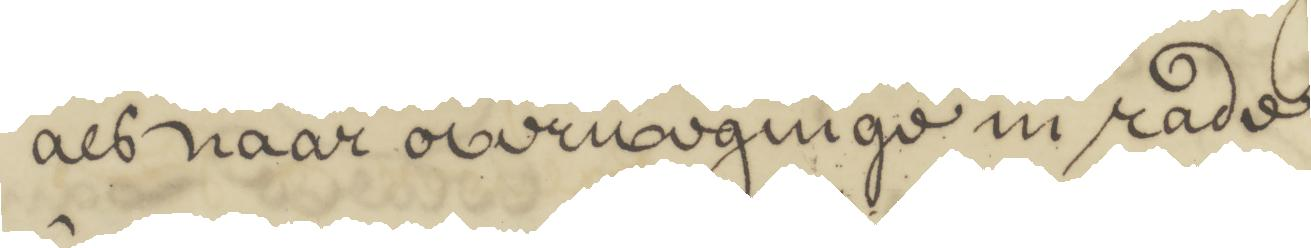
als naar overweginge in rade
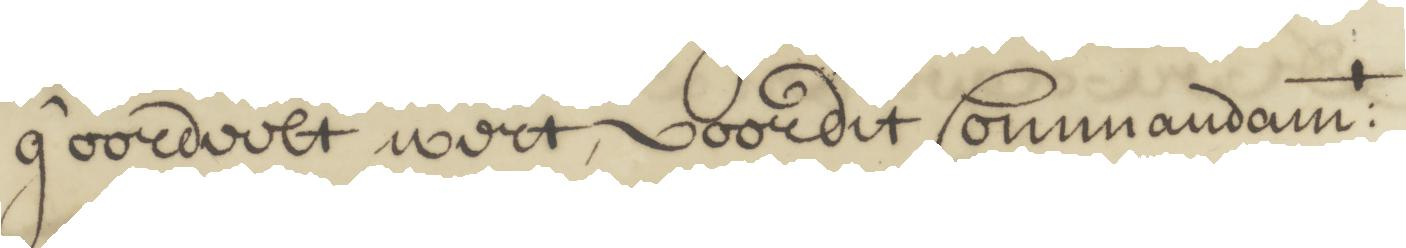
g’oordeelt wert, voor dit Commandam:t
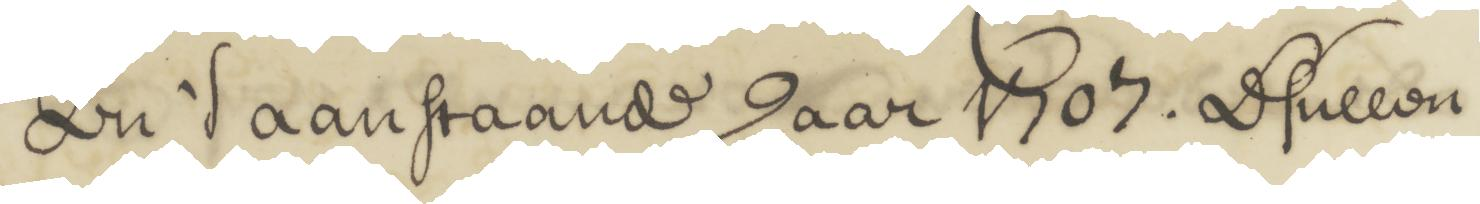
en ’t aanstaande Jaar 1707. te sullen
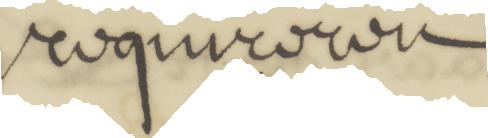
requireren
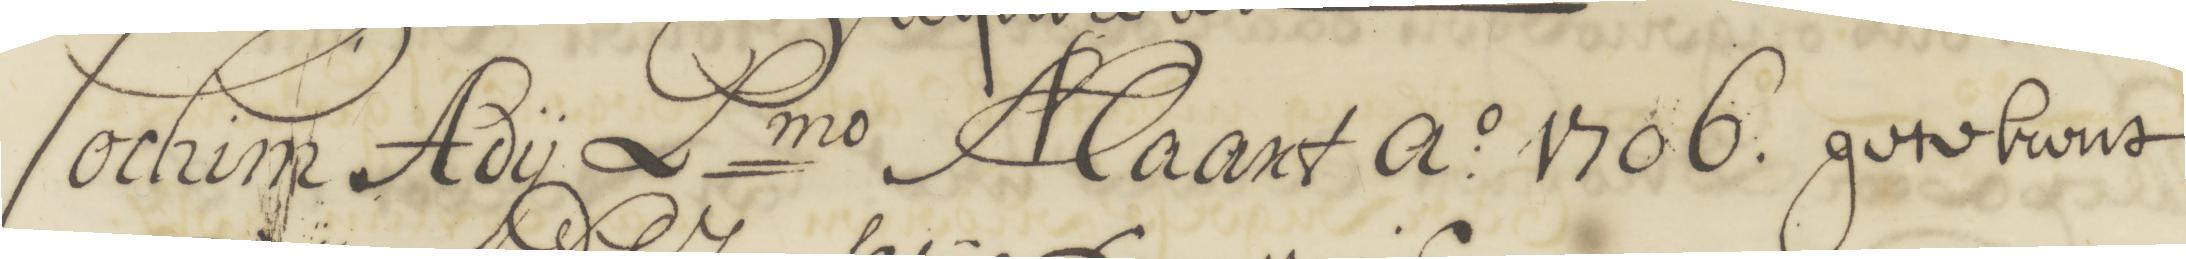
Cochim Adij P=mo Maart a:o 1706. getekent
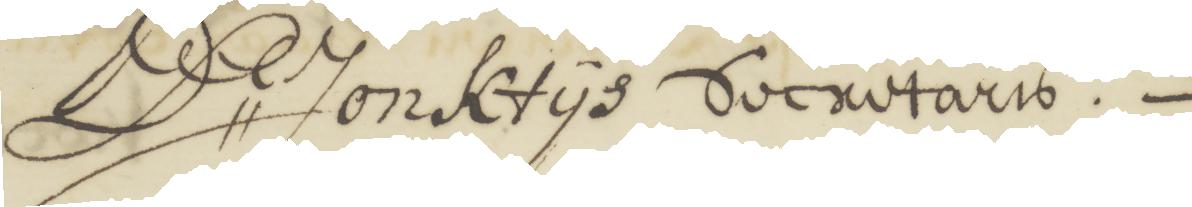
D„l Jonktijs Secretaris. —
